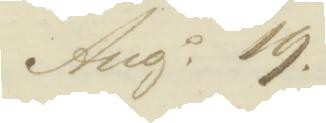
Aug„o 19.
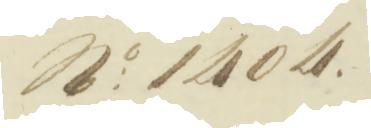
N:o 1404.
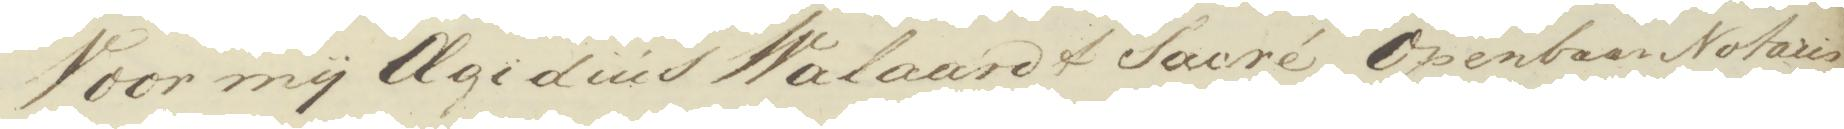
Voor mij Aegidius Walaardt Sacré Openbaar Notaris
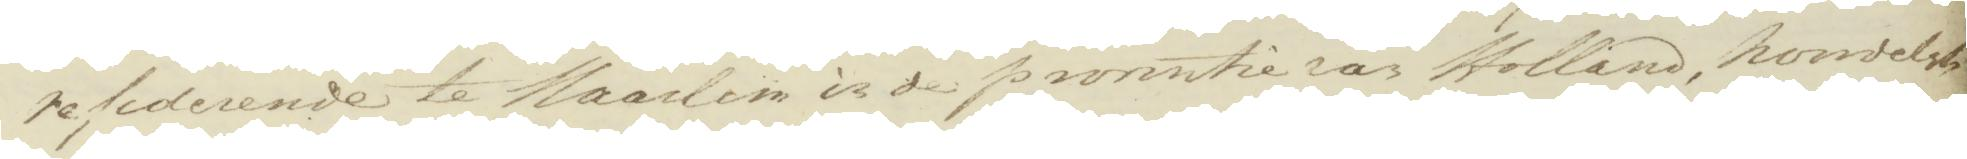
residerende te Haarlem in de provintie van Holland, Noordelyk
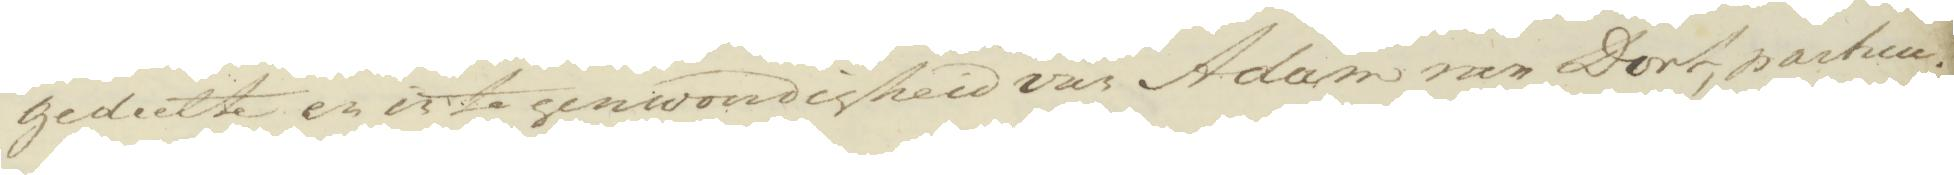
gedeelte en in tegenwoordigheid van Adam van Dort, particu
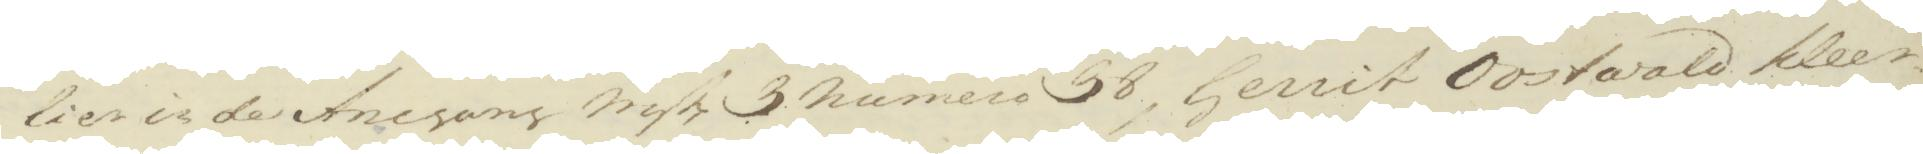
lier in de Anegang wyk 3 numero 38, Gerrit Oostwald kleer
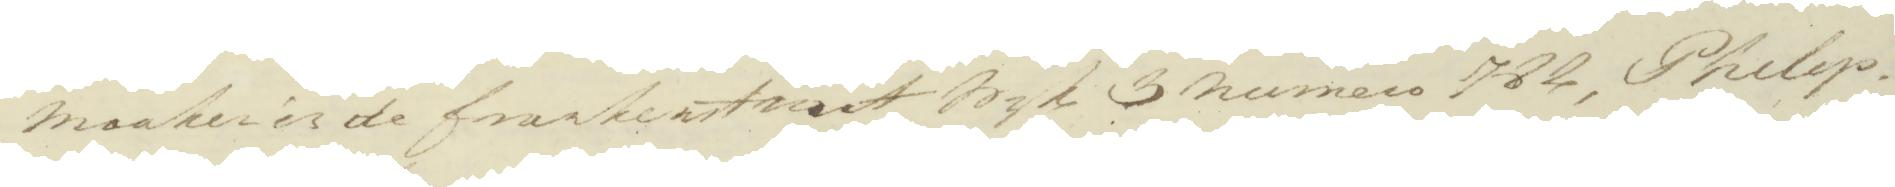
maaker in de frankenstraat Wyk 3 numero 782, Philip.
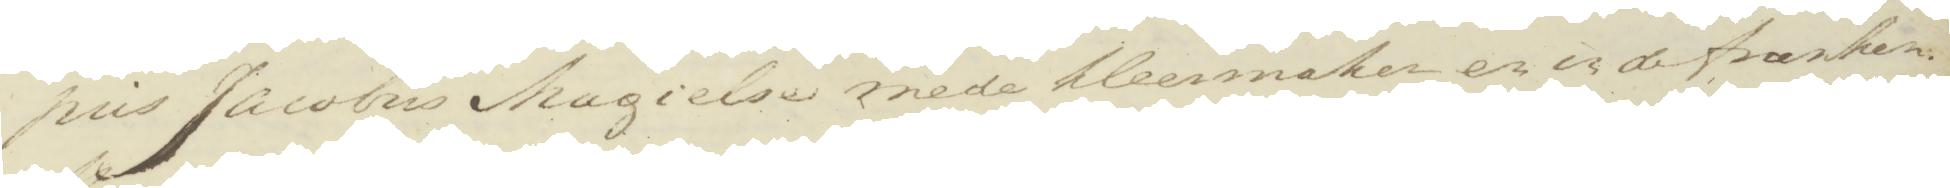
pus Jacobus Magielse mede kleermaker en in de franken„
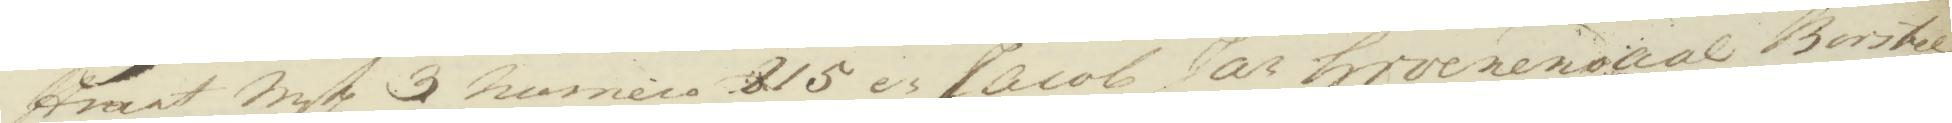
straat Wyk 3 numero 815 en Jacob Jan Groenendaal Borstel
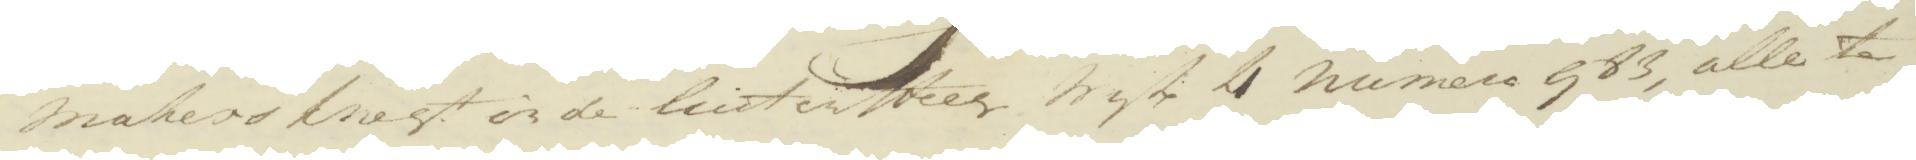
makersknegt in de luitensteeg wyk 4 numero 983, alle te
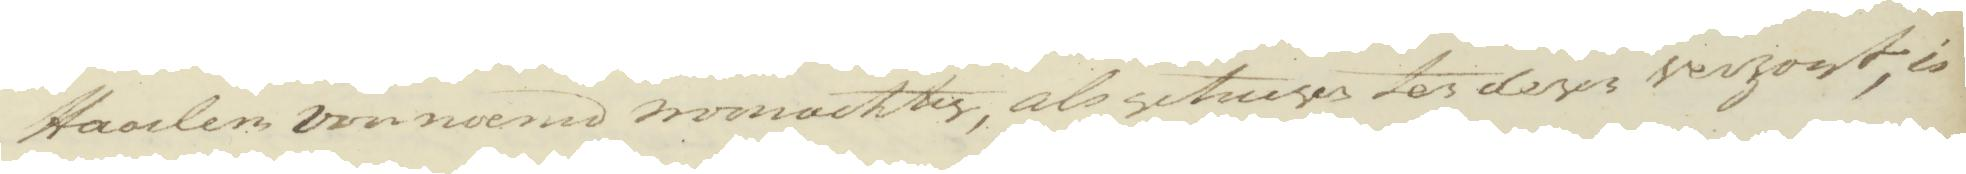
Haarlem voornoemd woonachtig, als getuigen ten dezen verzogt, is
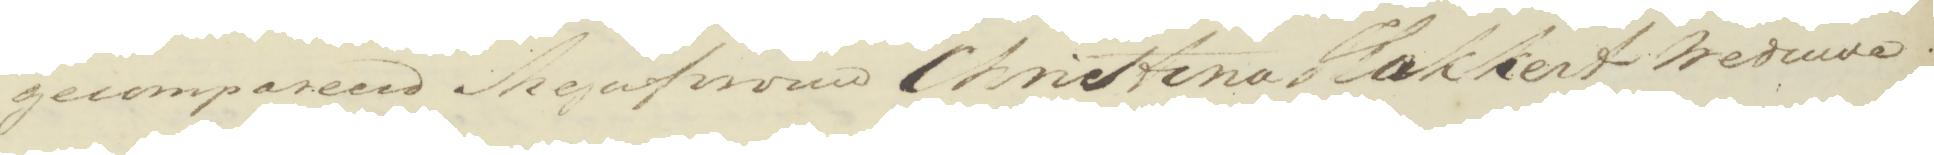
gecompareerd Mejufvrouw Christina Hakkert weduwe
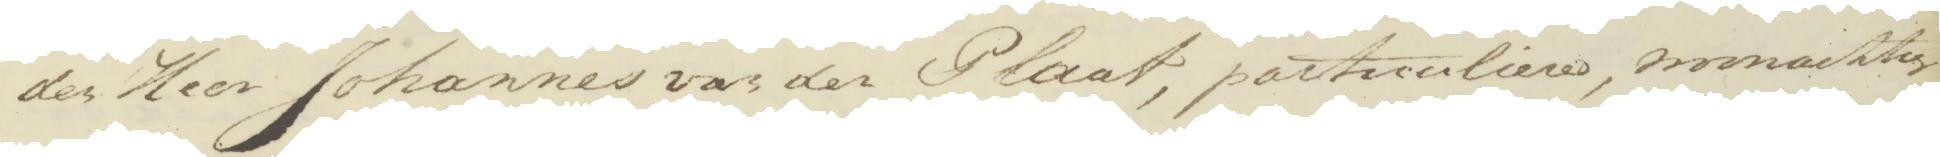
den Heer Johannes van der Plaat, particuliere, woonachtig
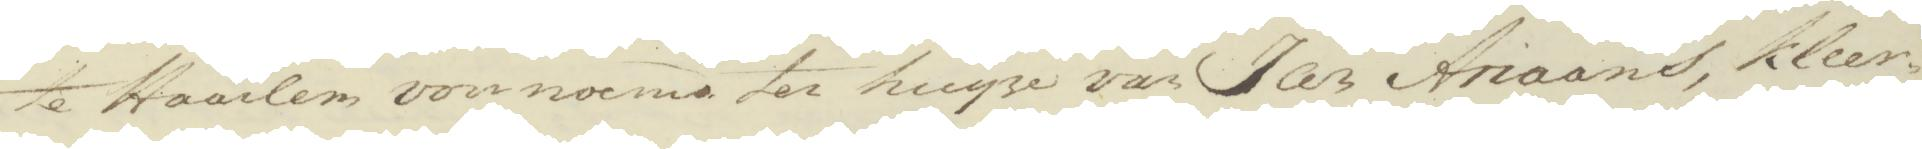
te Haarlem voornoemd ten huyze van Jan Ariaans, Kleer„
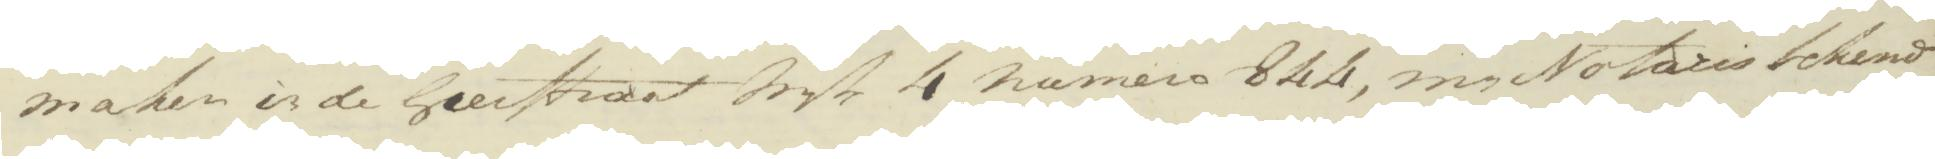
maken in de Gierstraat wyk 4 numero 844, my Notaris bekend
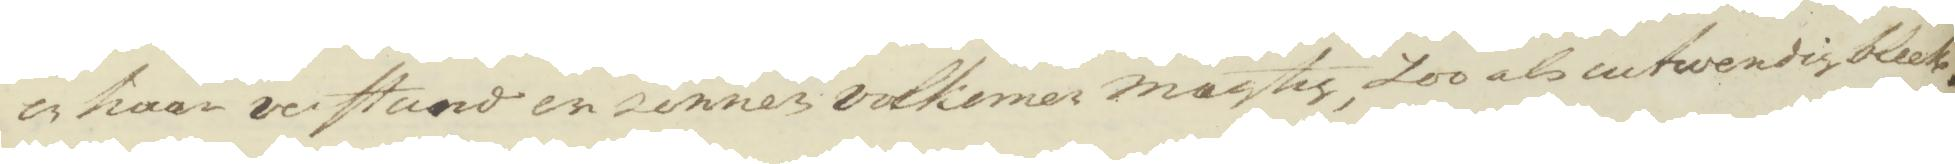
en haar verstand en zinnen volkomen magtig, Zoo als uitwendig bleek
